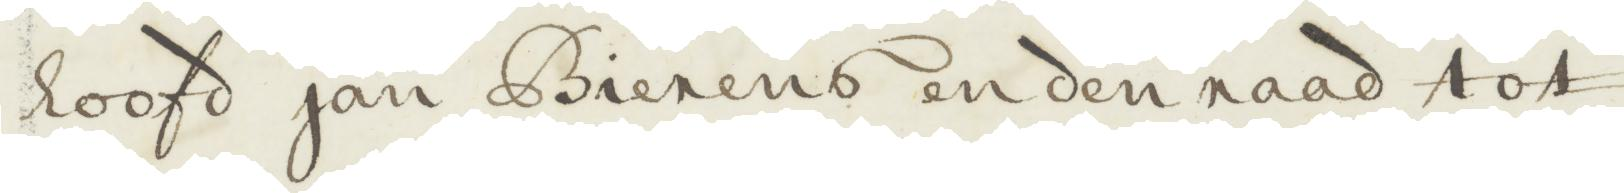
hoofd jan Bierens en den raad tot
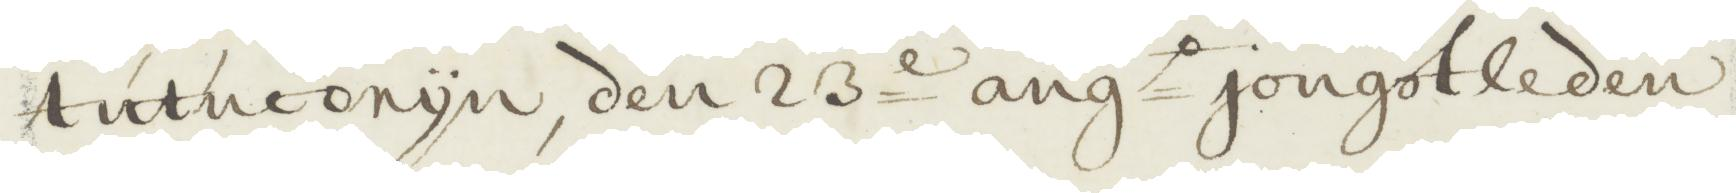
tutucorijn, den 23=e aug=o jongstleden
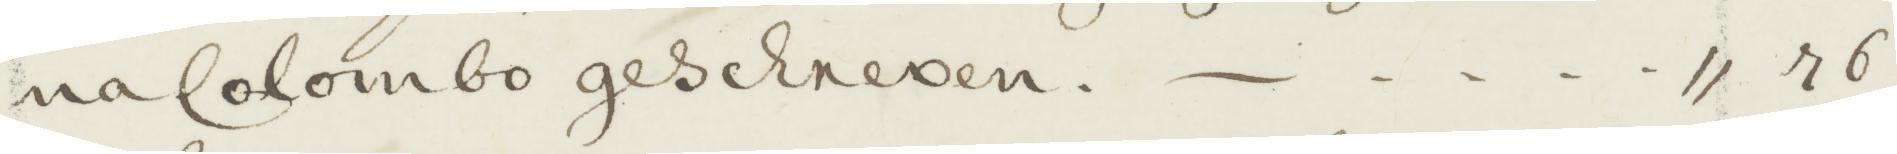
na Colombo geschreven. — - - - - „ 76
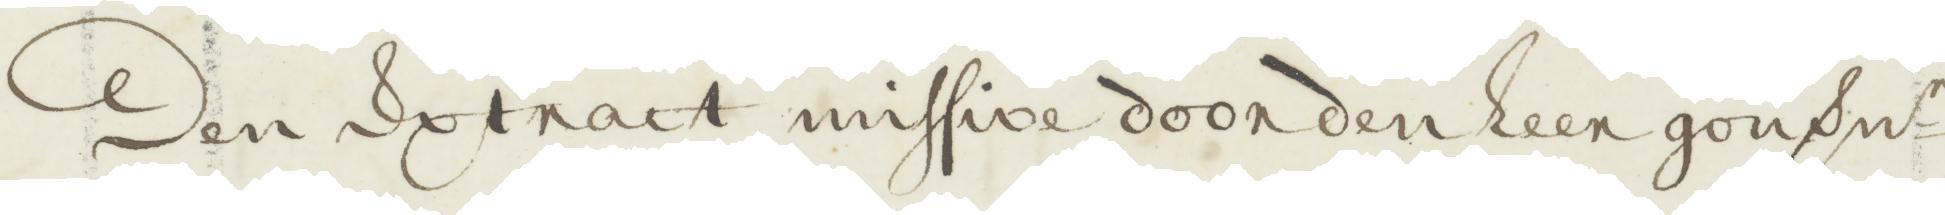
Den Extract missive door den heer gouvern=r
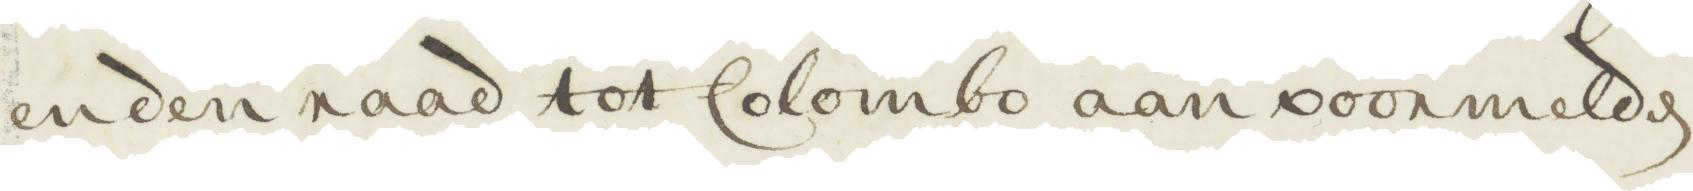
enden raad tot Colombo aan voormelden
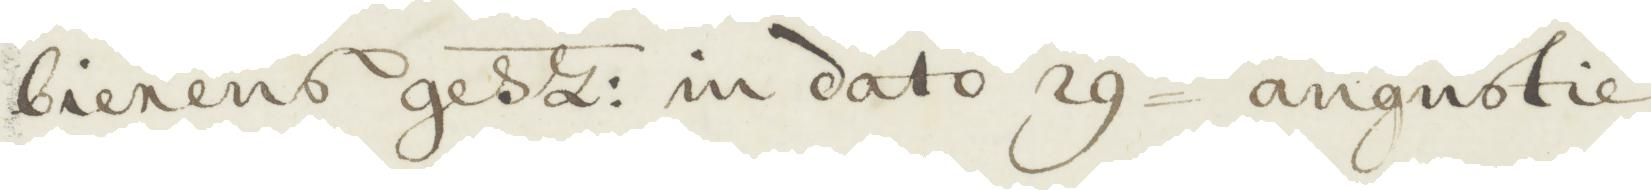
bierens gesz: in dato 29=e augustie
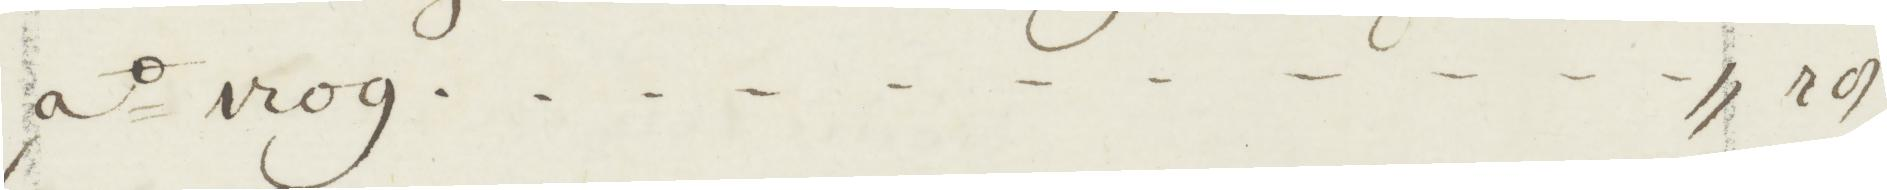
a=o 1709 - - - - - - - - - - - „ 78
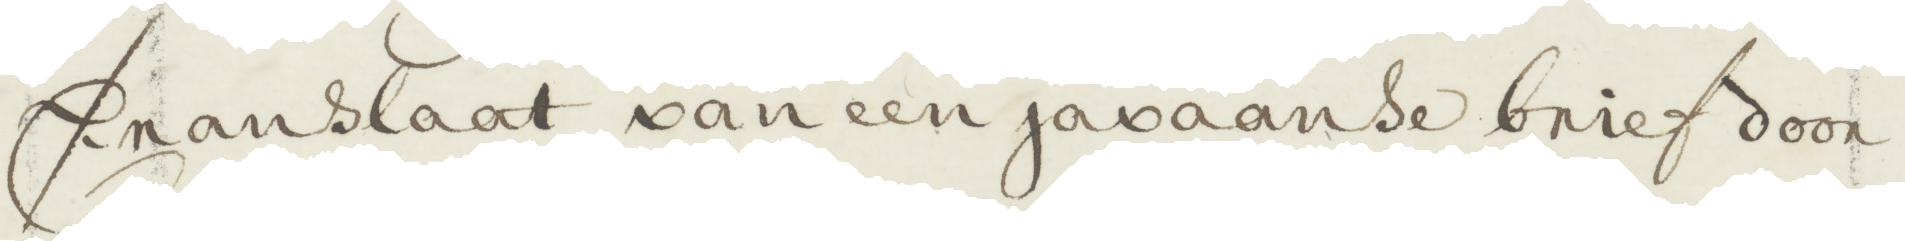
Translaat van een javaanse brief door
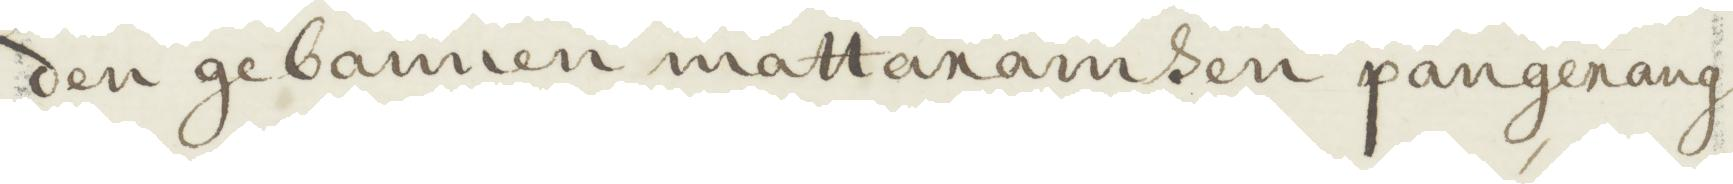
den gebannen mattaramsen pangerang
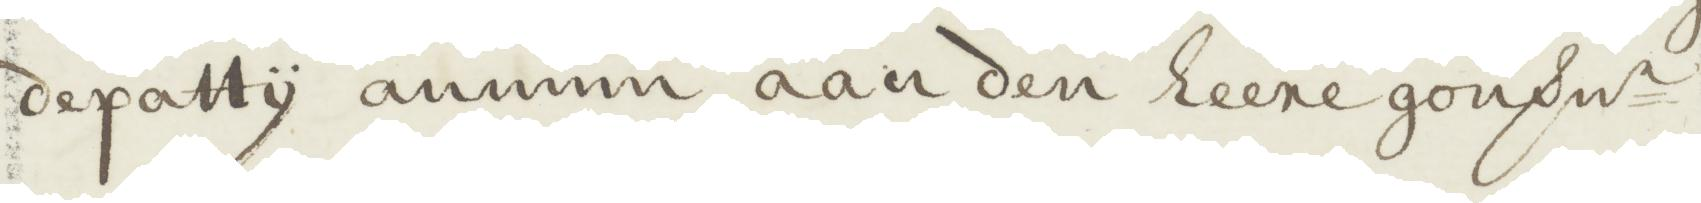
depattij annum, aan den heere gouvern=r
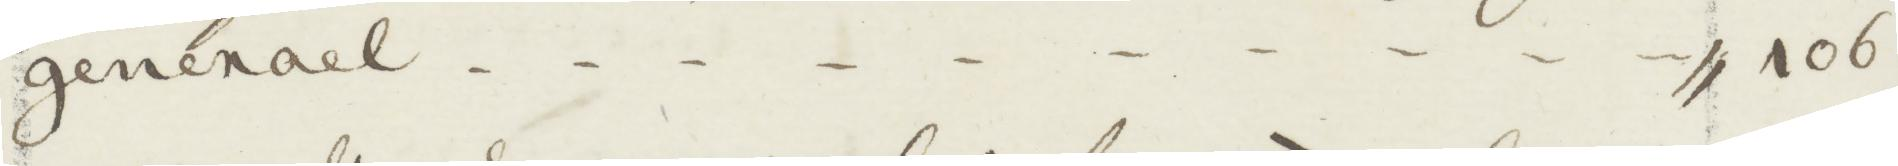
generael - - - - - - - - - - „ 106
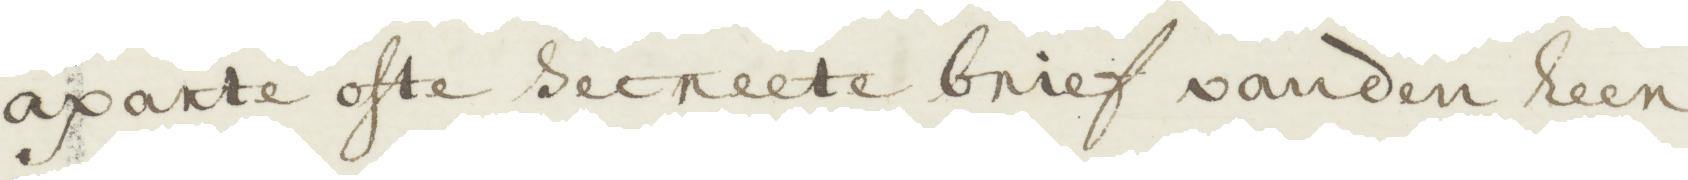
aparte ofte secreete brief vanden heer
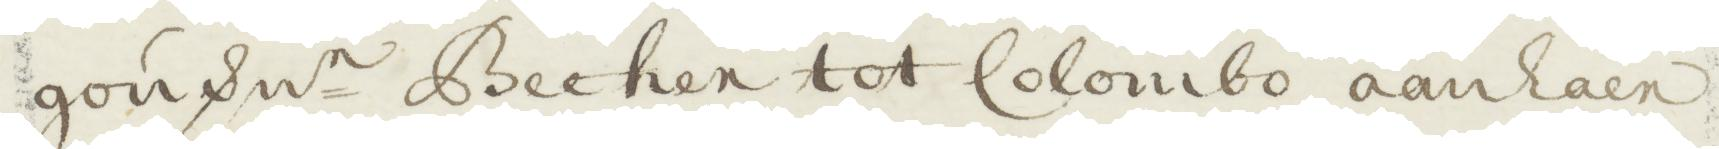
gouvern=r Becker tot Colombo aan haer
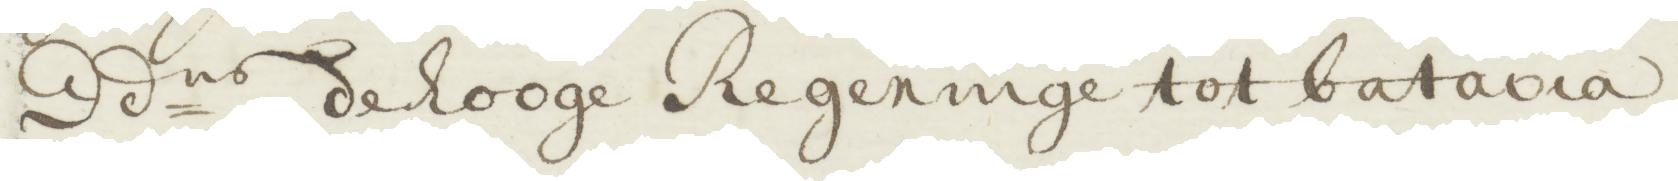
Ed=ns de hooge Regeringe tot batavia
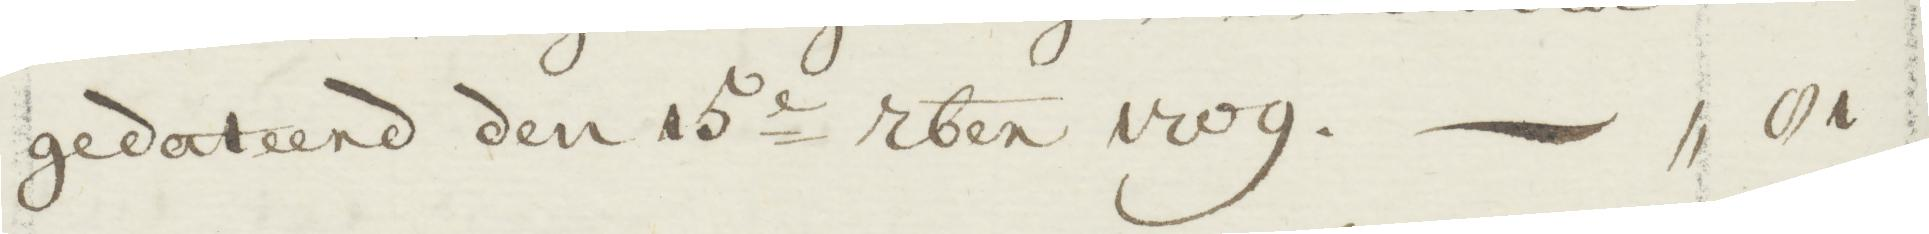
gedateerd den 15=e 7ber 1709. — „ 81
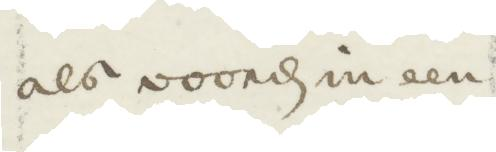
als vooren in een
